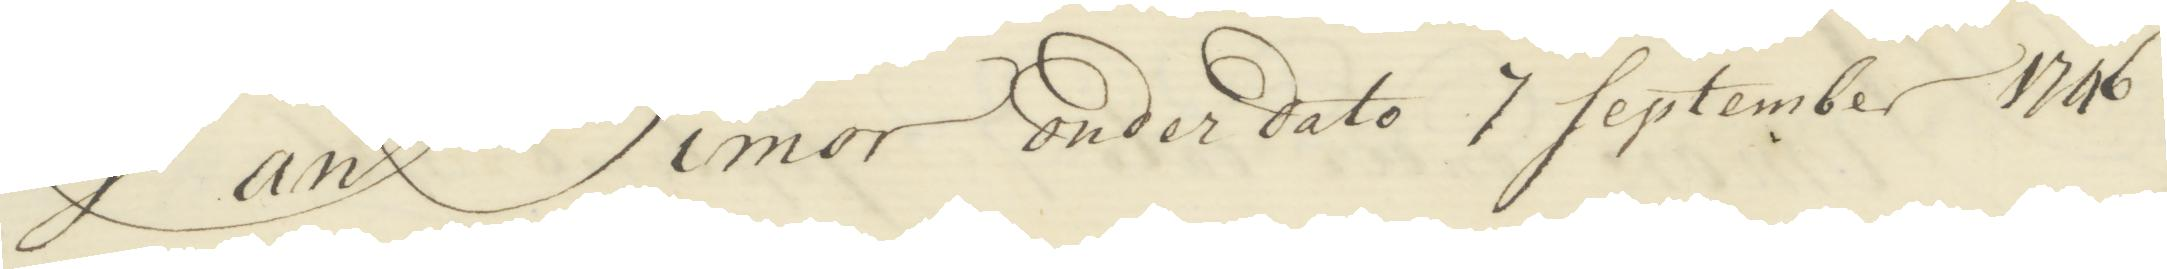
Van Timor onder dato 7 september 1746
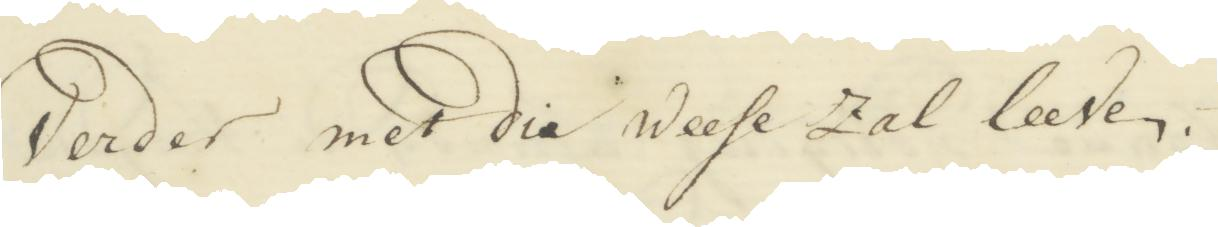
verder met die weese zal leeven.
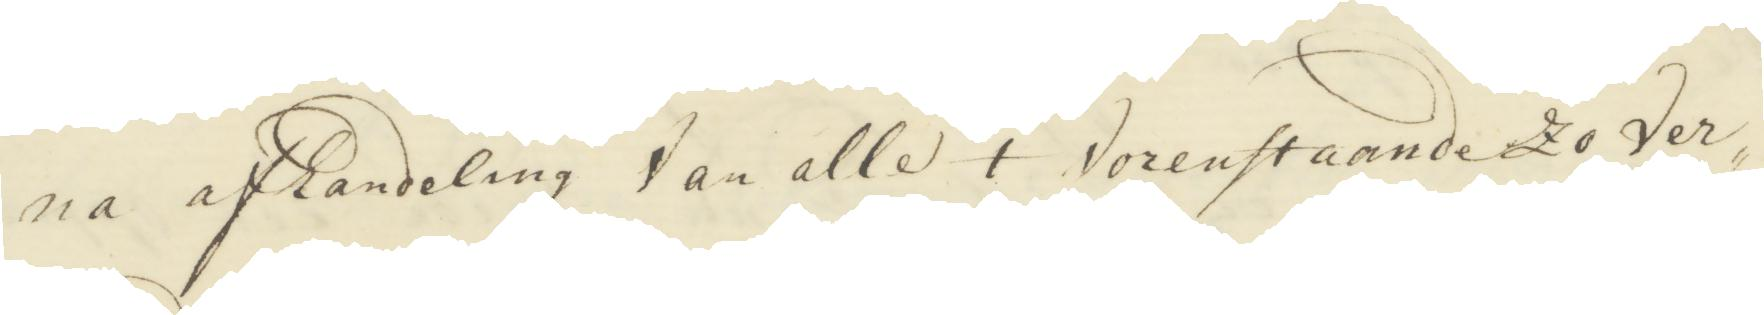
na afhandeling van alle ’t vorenstaande zo ver„
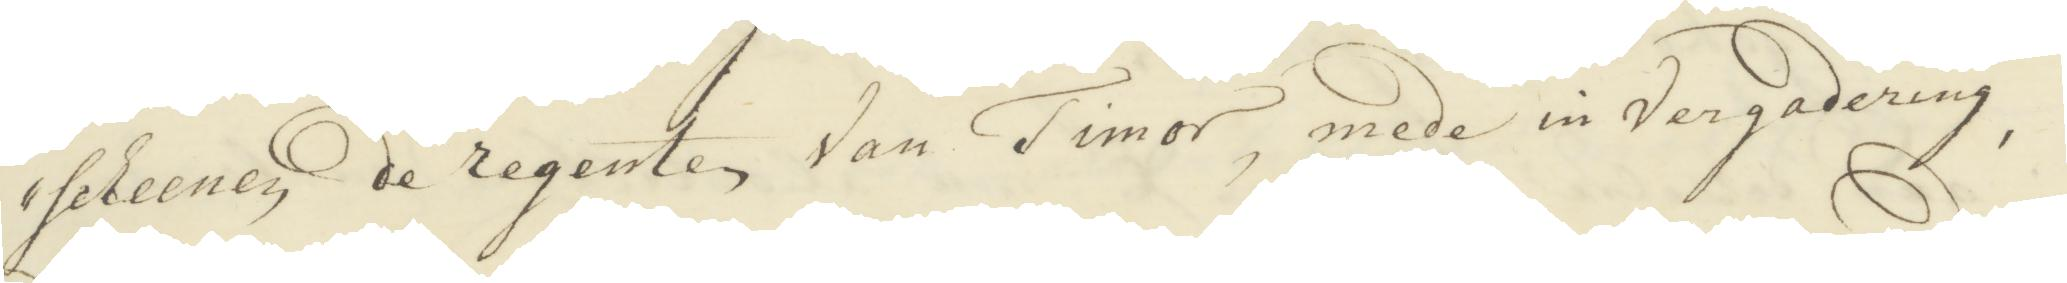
„scheenen de regenten van Timor, mede in vergadering,
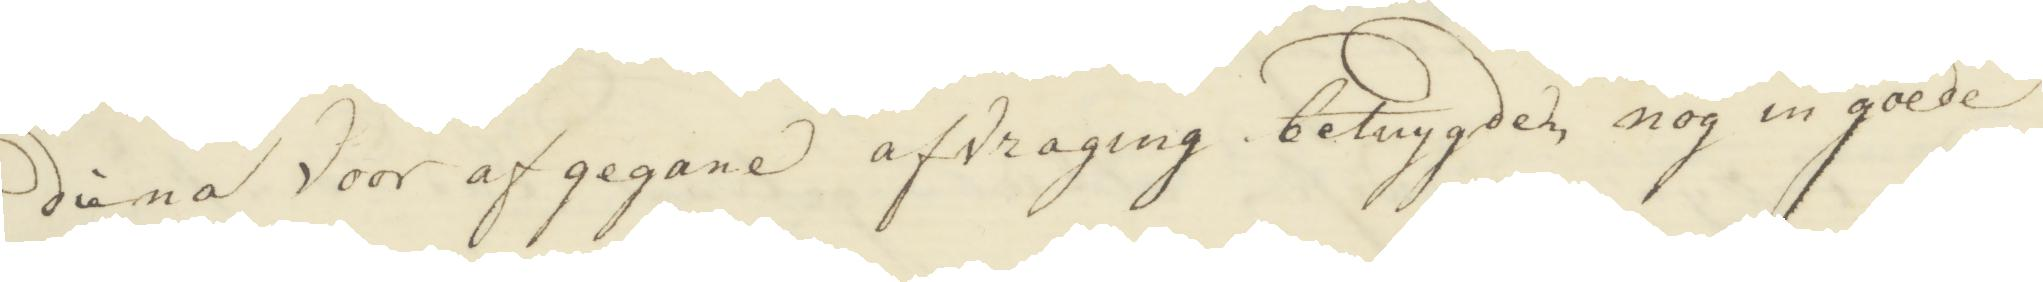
die na voor af gegane afvraging betuygden nog in goede
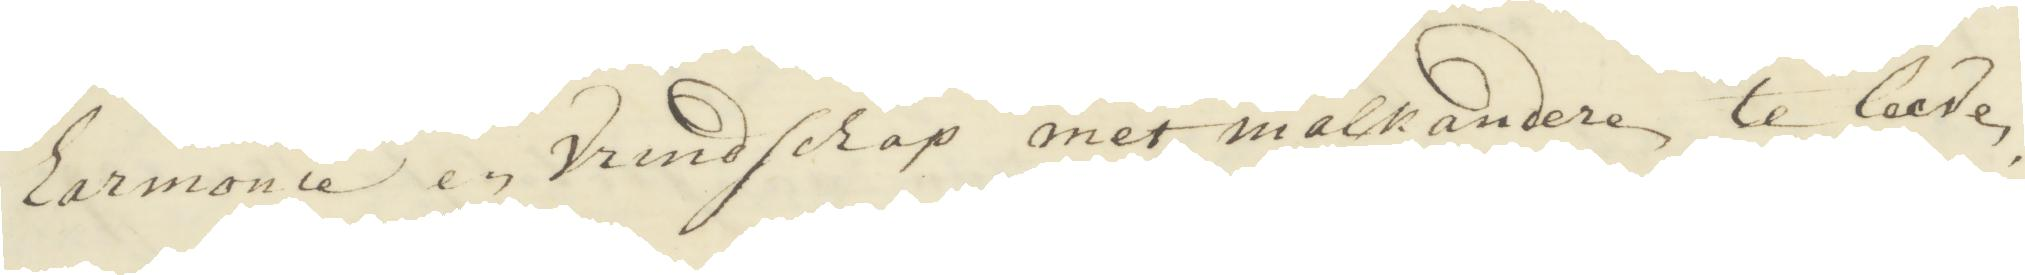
harmonie en vrindschap met malkandere te leeven,
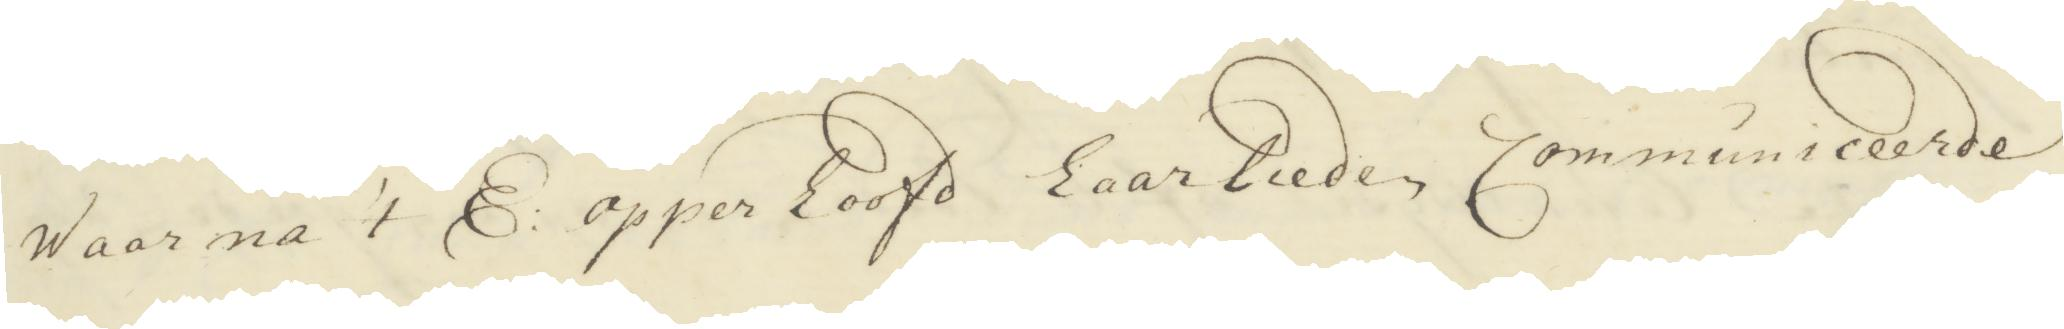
waar na ’t E: opperhoofd haarlieden communiceerde,
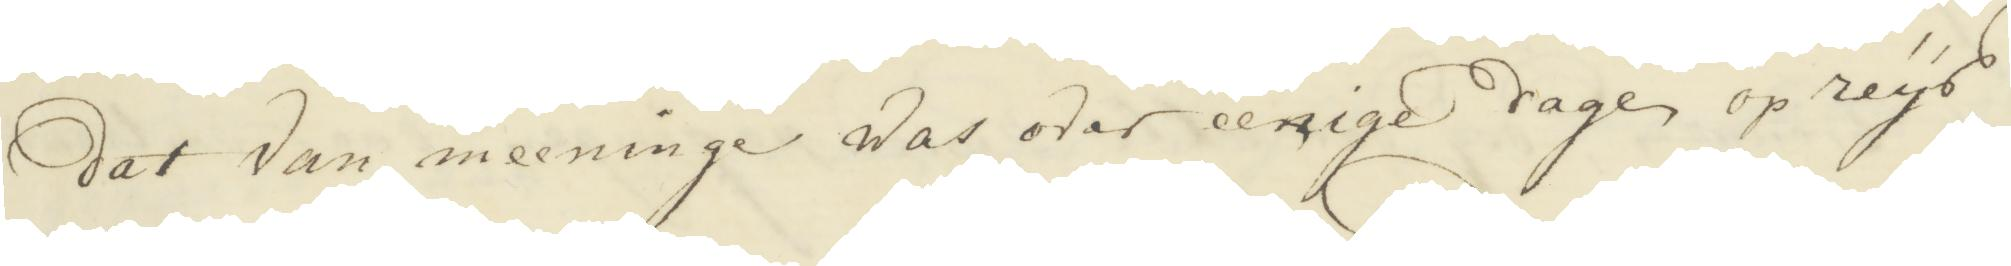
dat van meeninge was over eenige dagen op reijs
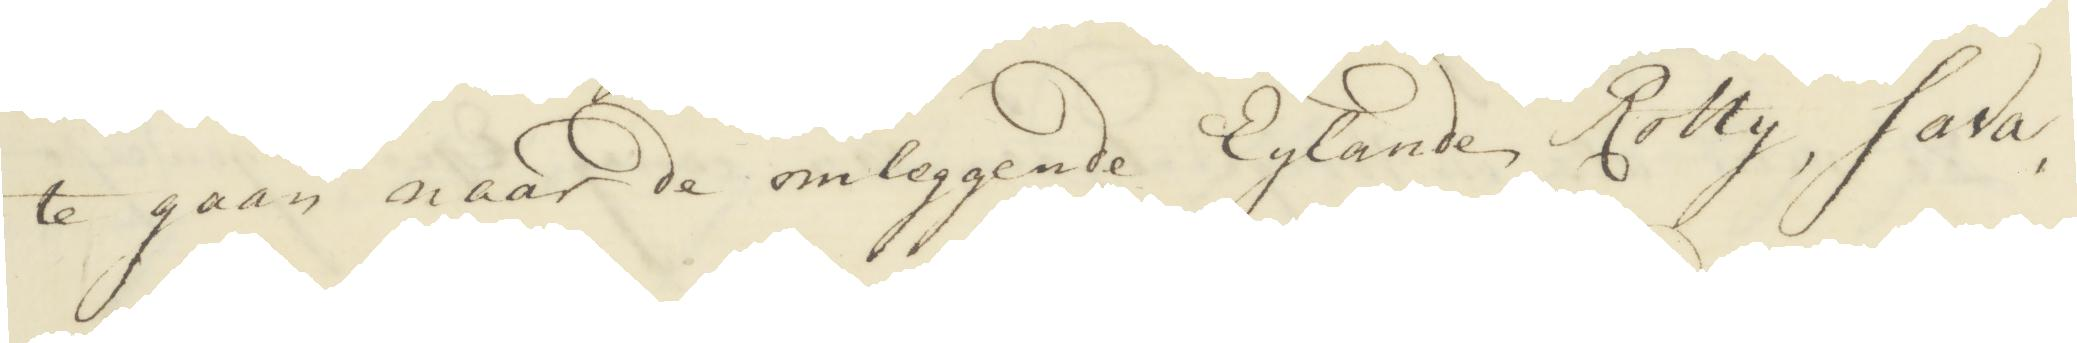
te gaan naar de omleggende Eijlanden Rottij, Sava,
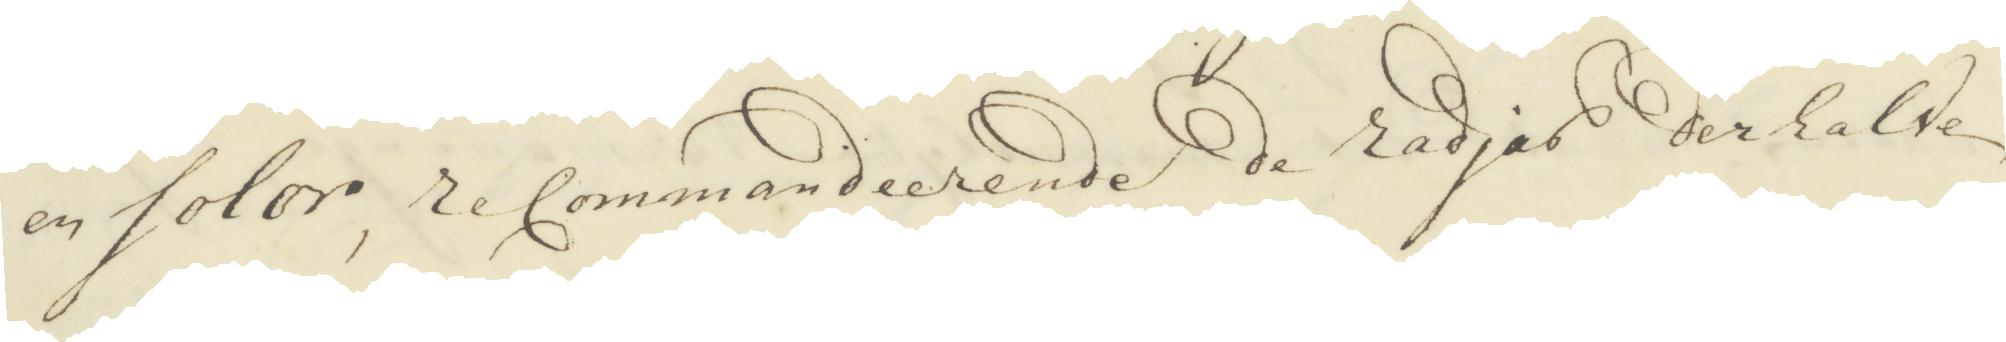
en Solor, recommandeerende de radjas derhalven
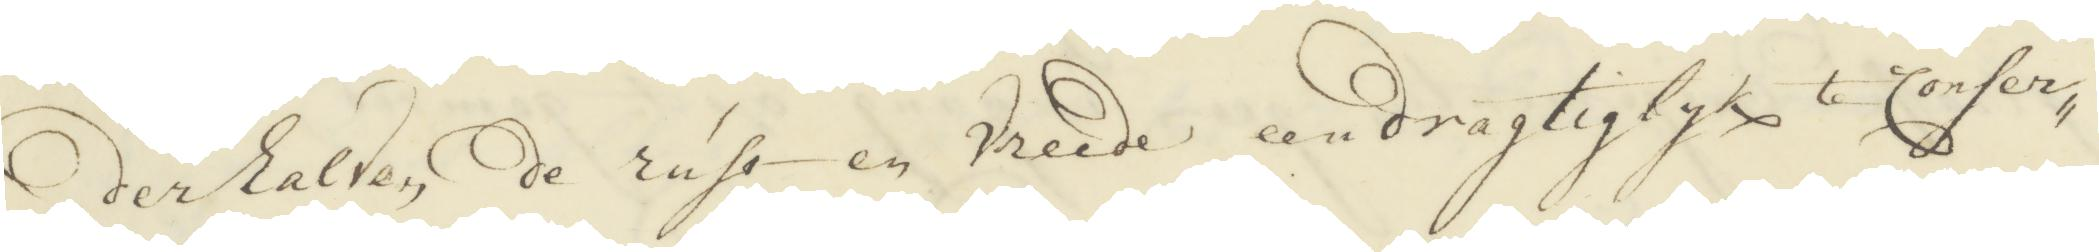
derhalven de rust en vreede eendragtiglyk te conser„
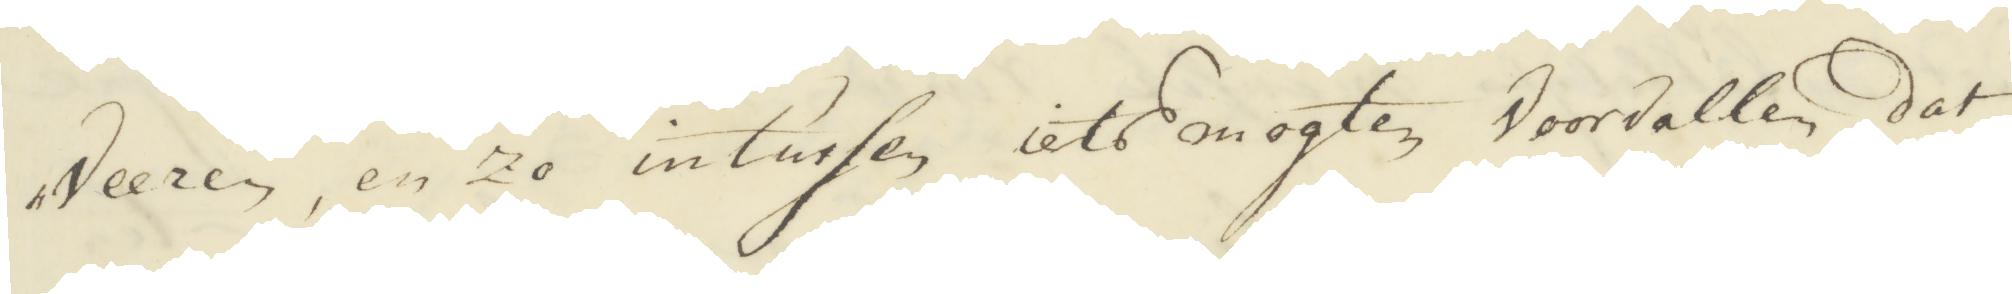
„veeren, en zo intussen iets mogten voorvallen, dat
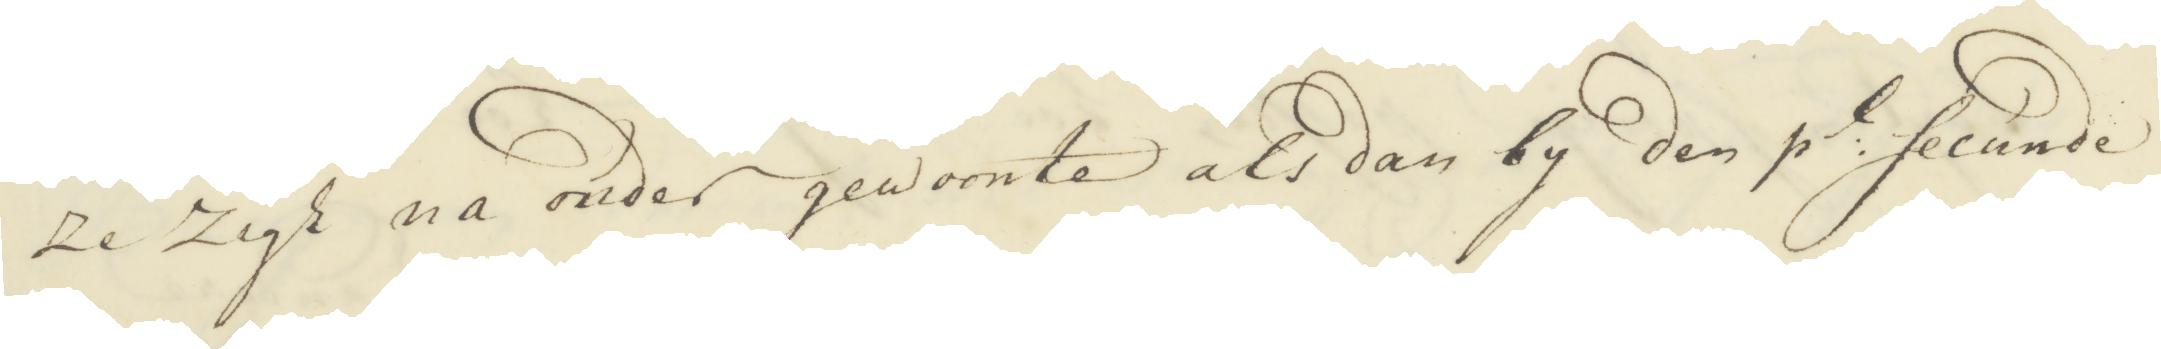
ze zigh na ouder gewoonte als dan by den p:l secunde
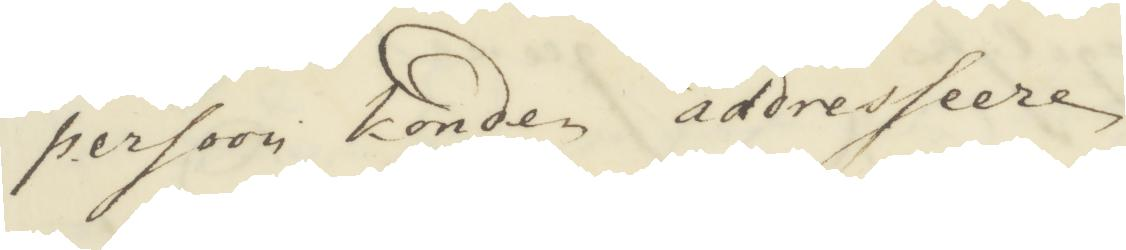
persoon konden addresseeren
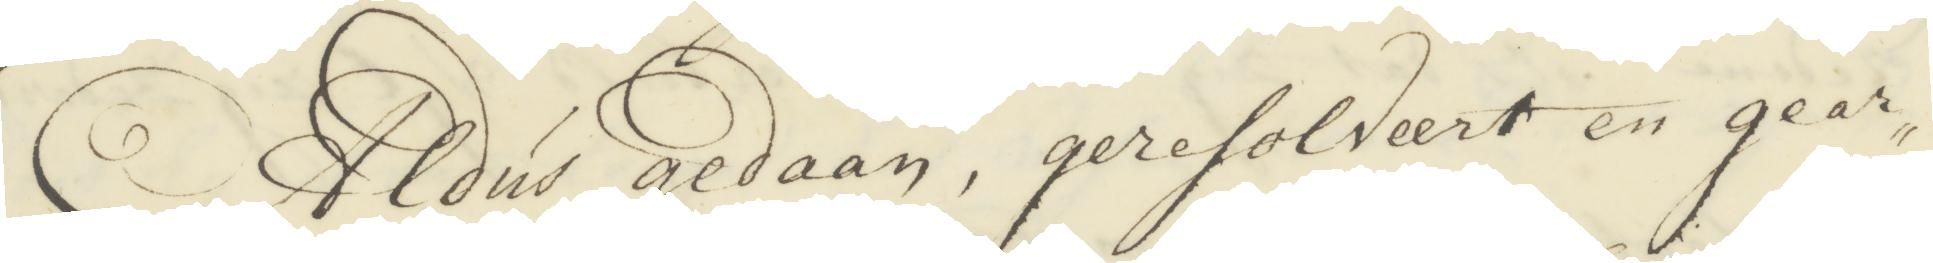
Aldus gedaan, geresolveert en gear„
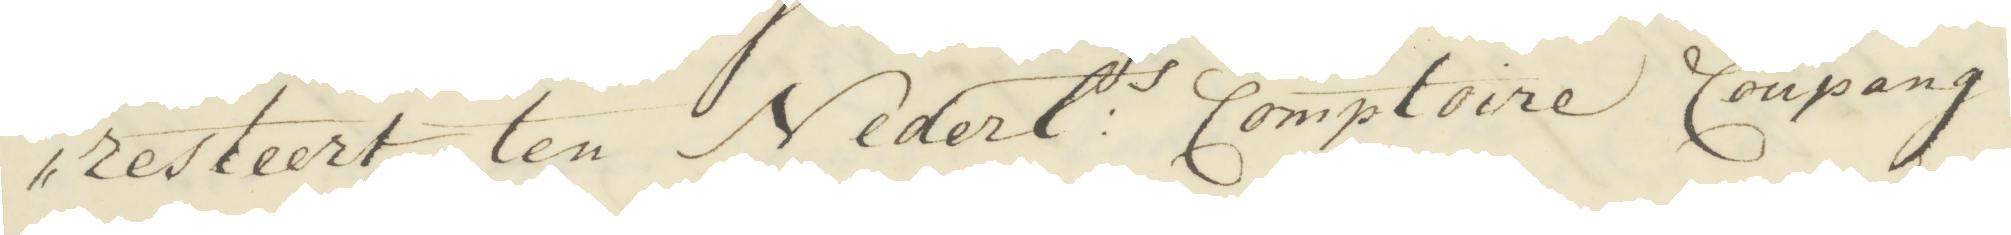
„resteert ten Nederl:s comptoire coupang
